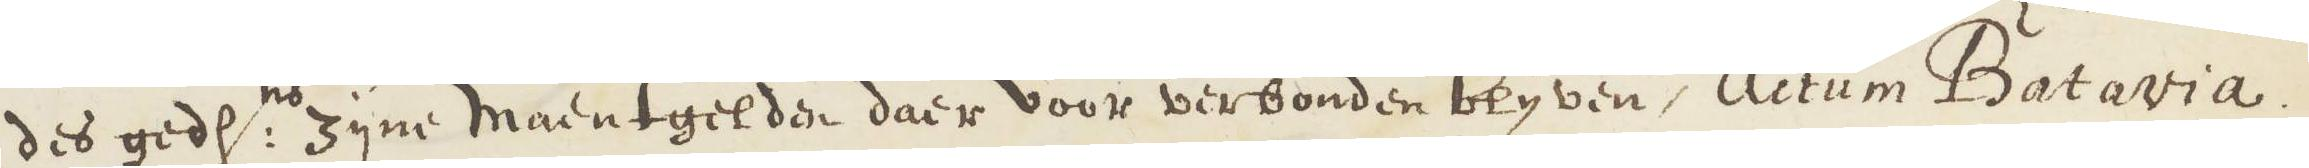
des gedh:ns zijne maentgelden daer voor verbonden blijven, Actum Batavia.
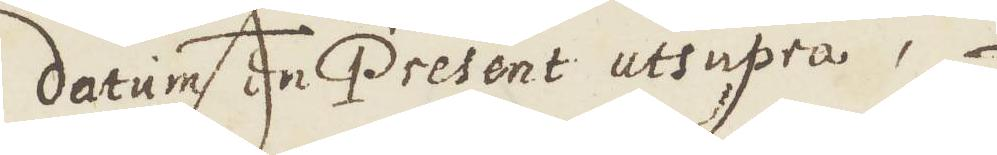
datum ende Present utsupra /
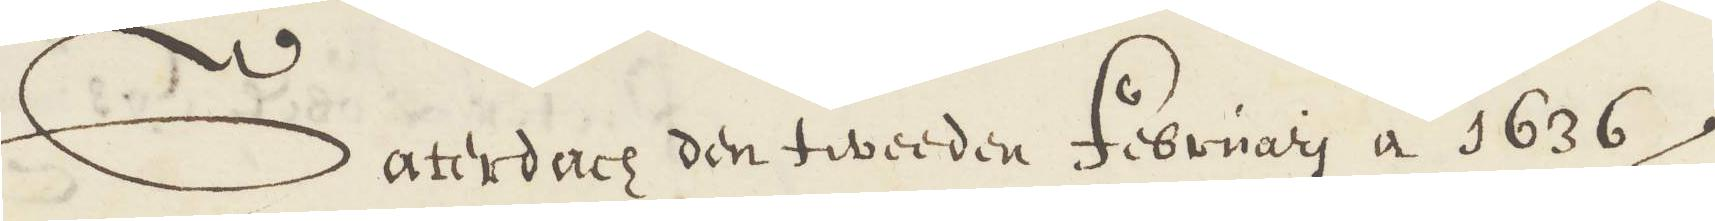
Saterdach den tweeden Februarj ao 1636
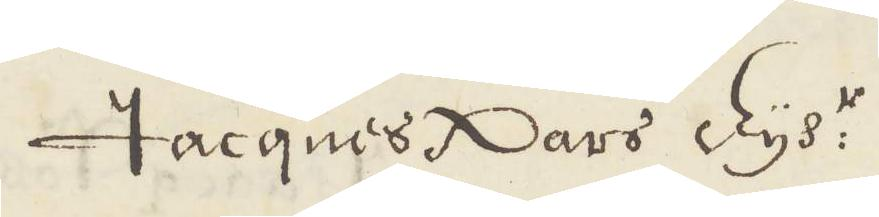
Jacques Pars Eijs:r
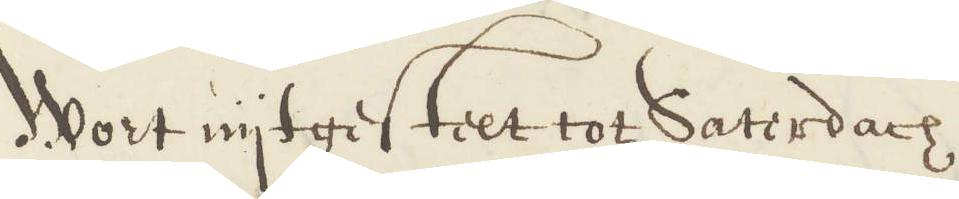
Wort uijtgestelt tot Saterdach
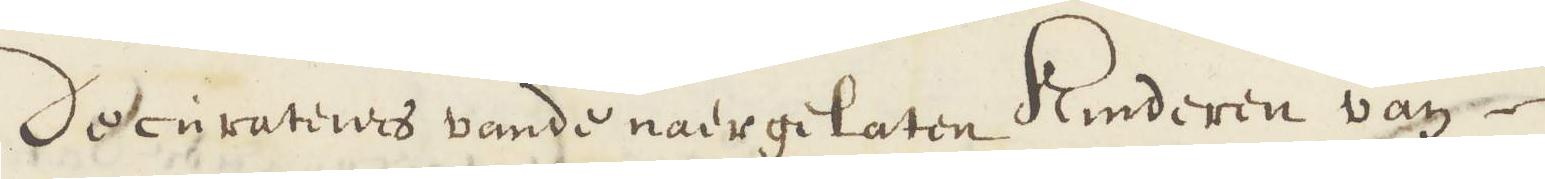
De curateurs vande naer gelaten kinderen van
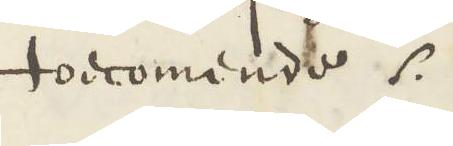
toecomende /.
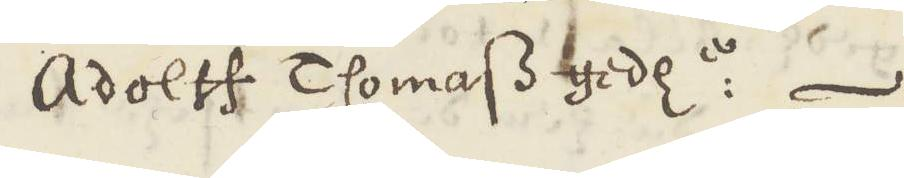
adolfs Thomass gedh:e —
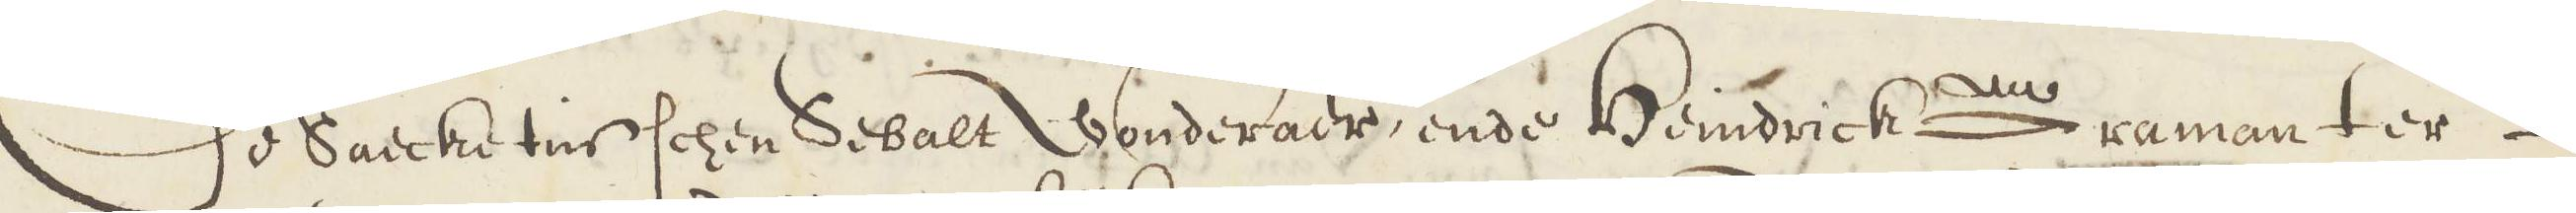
De saecke tusschen Sebalt Wonderaer, ende Hendrick Graman ter –
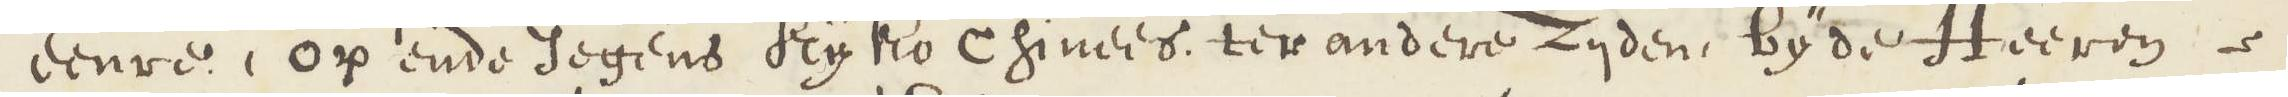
eenre. / op ende Iegens kijko Chinees. ter andere zyden, bij de Heeren –
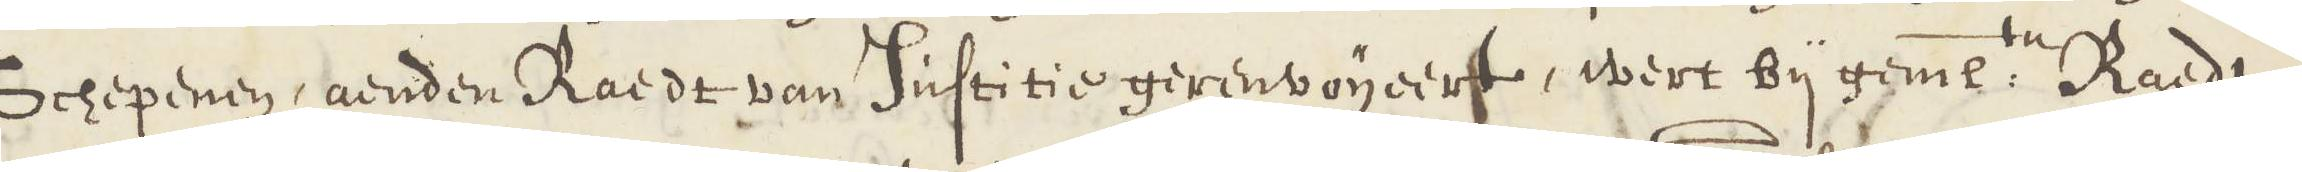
Schepenen, aenden Raedt van Justitie gerenvoijeert, wert bij geml:tn Raedt.
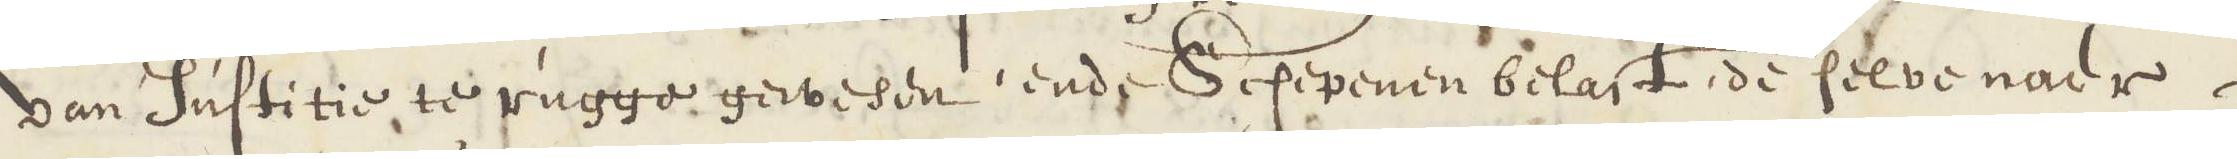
van Iustitie te rugge gewesen, ende Schepenen belast, de selve naer
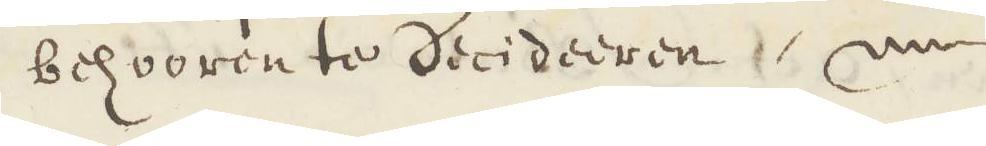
behooren te decideeren
